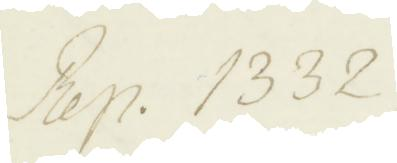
Rep. 1332
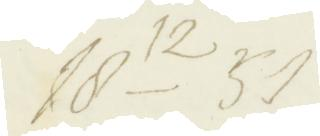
18 -12 51
